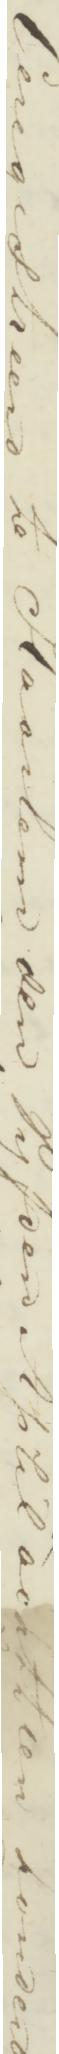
Geregistreerd te Haarlem den Vyfden April achttien honderd
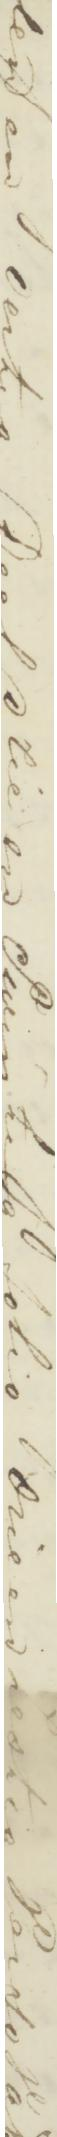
Een en dertig. Deel drie en Twintig folio drie en Zestig Verso Vak
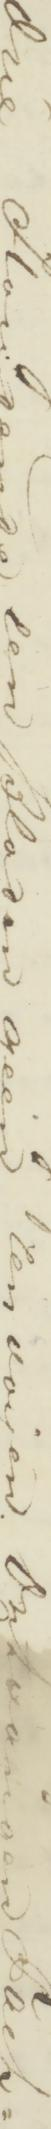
drie. Houdende Een Blad en geen renvoijen. Ontvangen Tach=
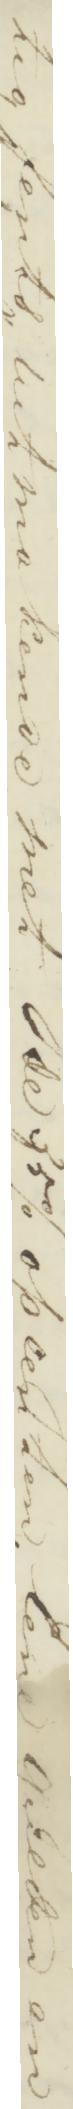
tig Cents, uitmakende met de 35% op centen, Eene gulden en
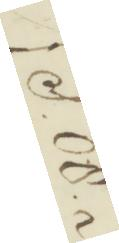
ƒ1. 08 . -
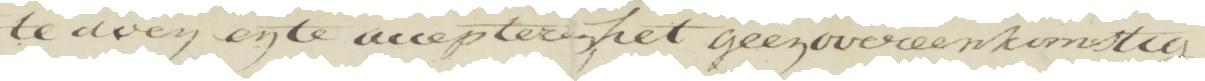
te doen en te accepteren, het geen overeenkomstig
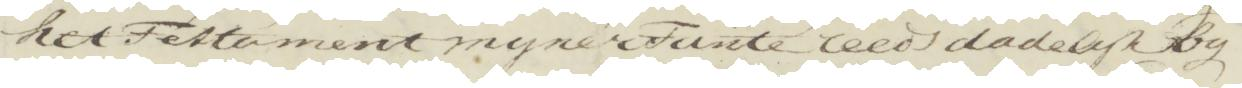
het Testament myner Tante reeds dadelyk by
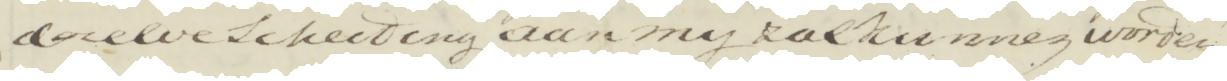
dezelve scheiding aan my zal kunnen worden
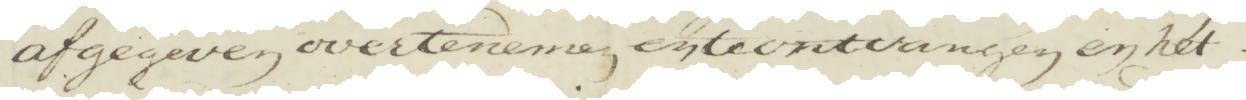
afgegeven overtenemen en te ontvangen en het
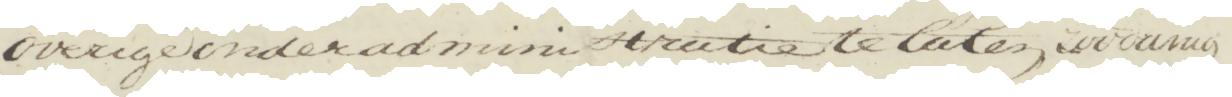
overige onder administratie te laten zoodanig
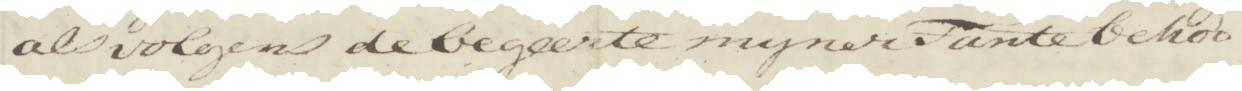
als volgens de begeerte myner Tante behoo
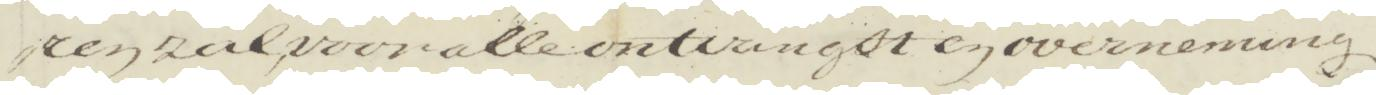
ren zal, voor alle ontvangst en overneming
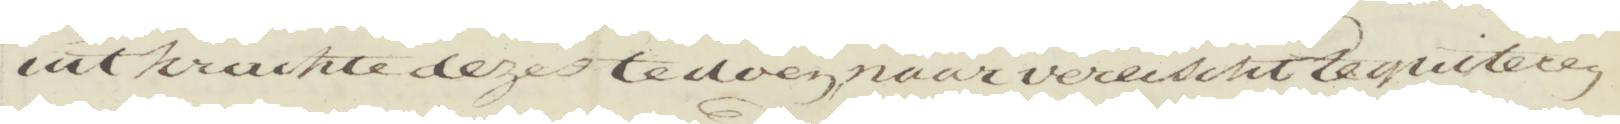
uit krachte dezes te doen, naar vereischt te quiteren
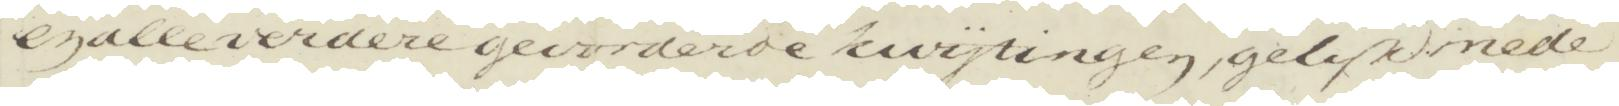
en alle verdere gevorderde kwijtingen, gelyk mede
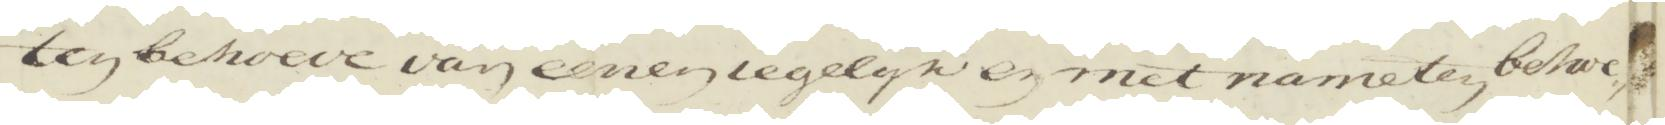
ten behoeve van eenen iegelyk en met name ten behoe„
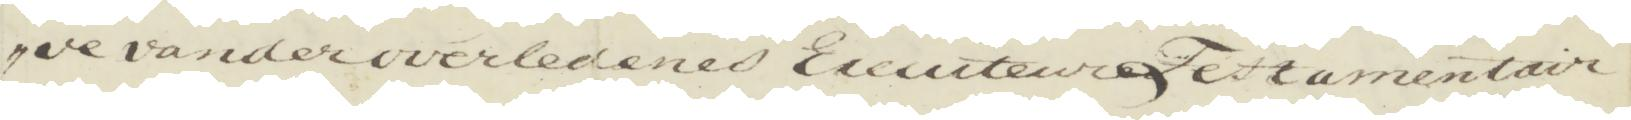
ve van der overledenes Executeure Testamentair
